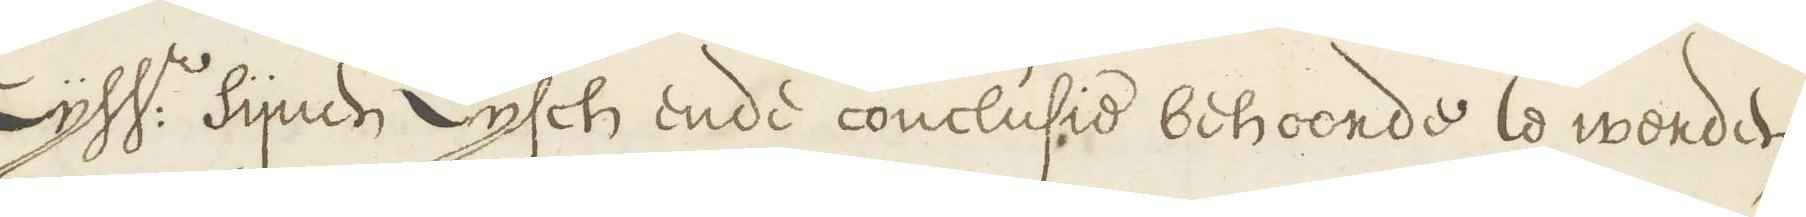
Eijss:r sijnen Eijsch ende conclusie behoorde te werden
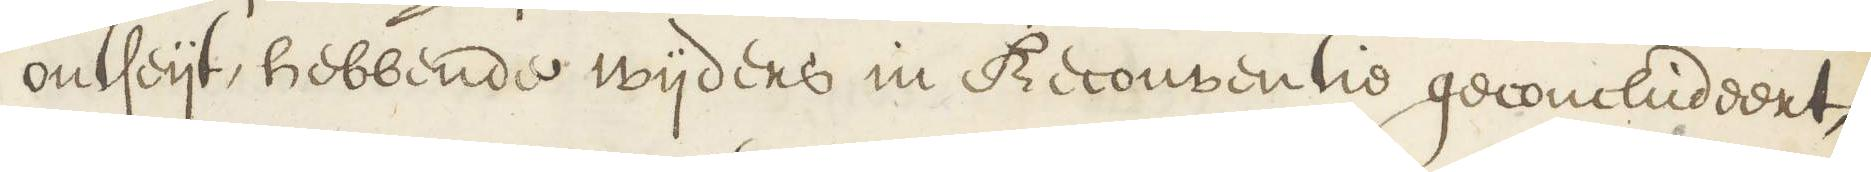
ontseijt, hebbende wijders in Reconventie geconcludeert,
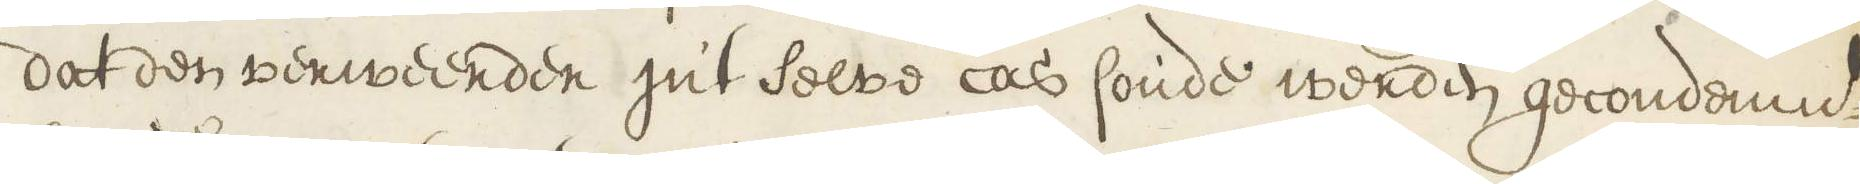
dat den verweerder jn't selve cas soude werden gecondemn=t,
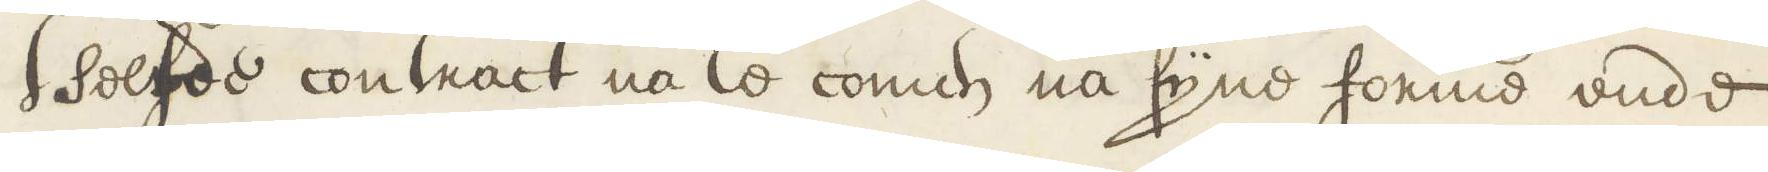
't selfde contract na te comen na sijne forme ende
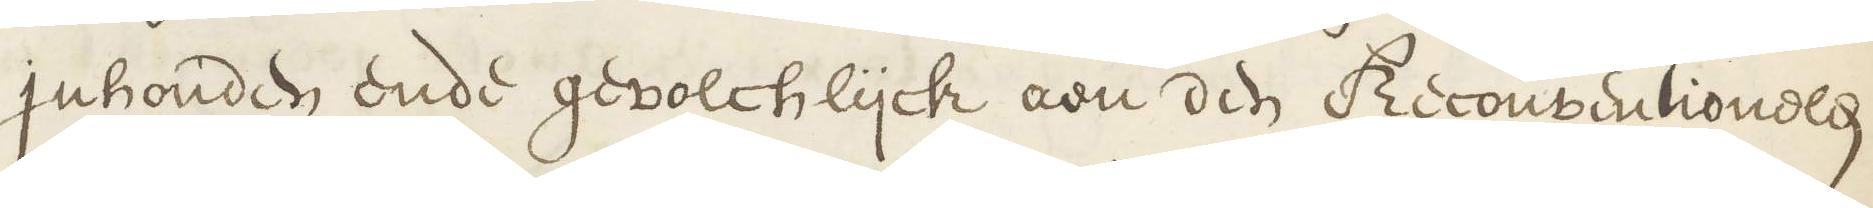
jnhouden ende gevolchlijck aen den Reconventionelen
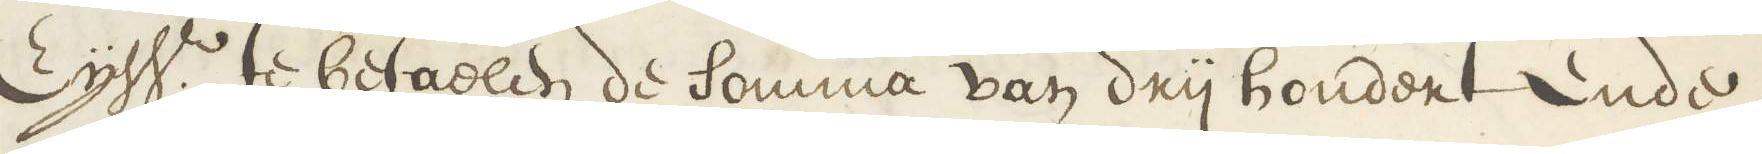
Eijss:r te betaelen de somma van drij hondert Ende
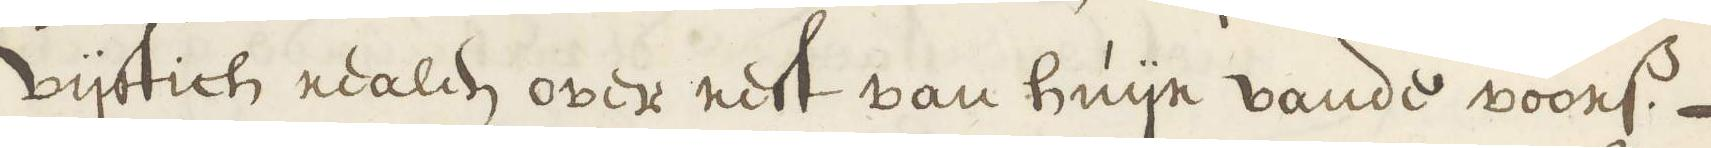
vijftich realen over rest van huijr vande voors._
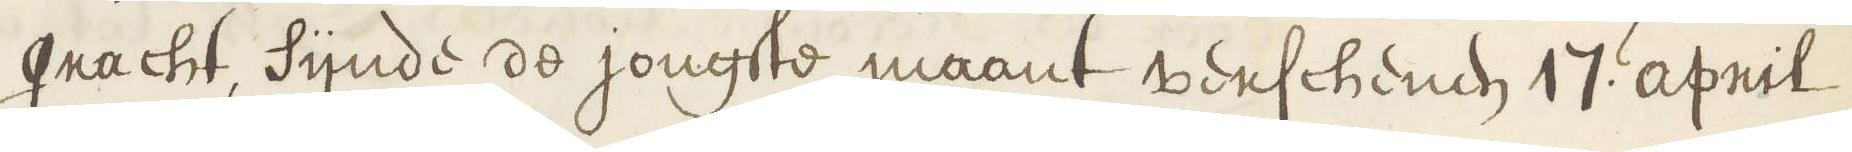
gracht, sijnde de jongste maant verschenen 17.' april
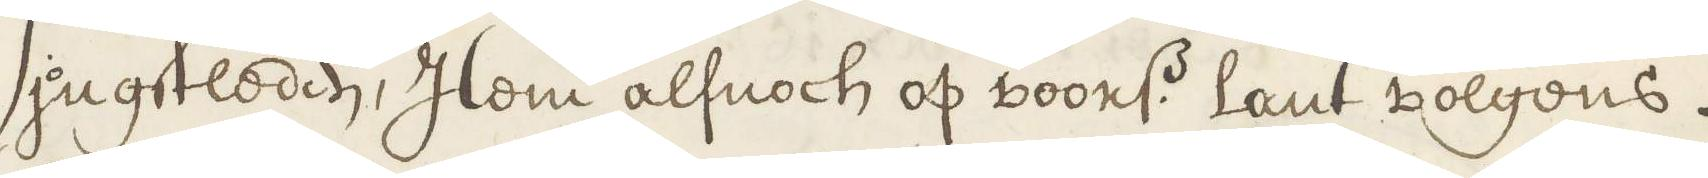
jongstleeden, Jtem alsnoch op voors. lant volgens
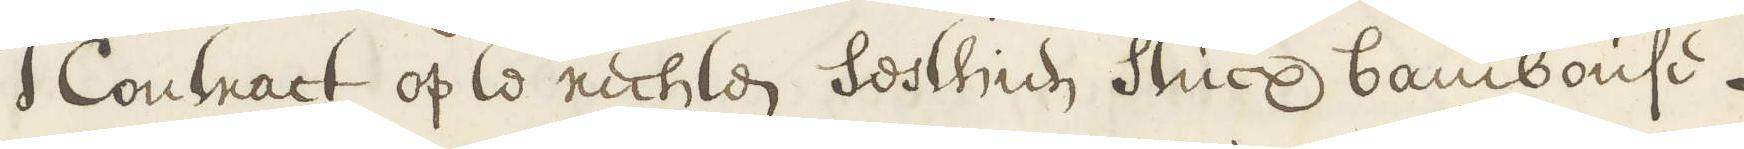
't Contract op te richten sesthien stucx bambouse
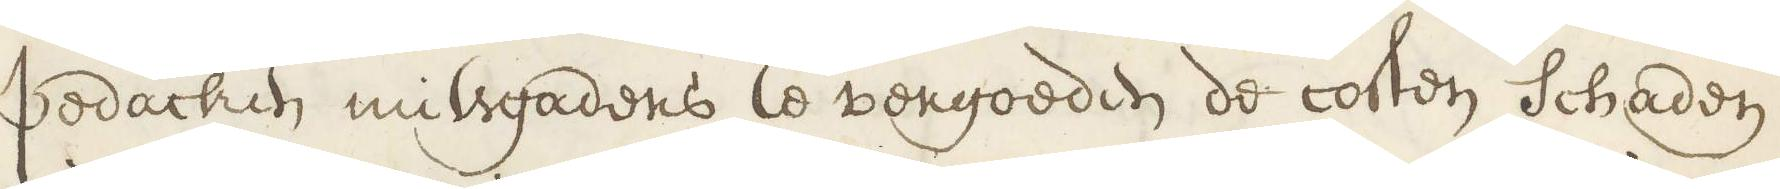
pedacken mitsgaders te vergoeden de costen schaden
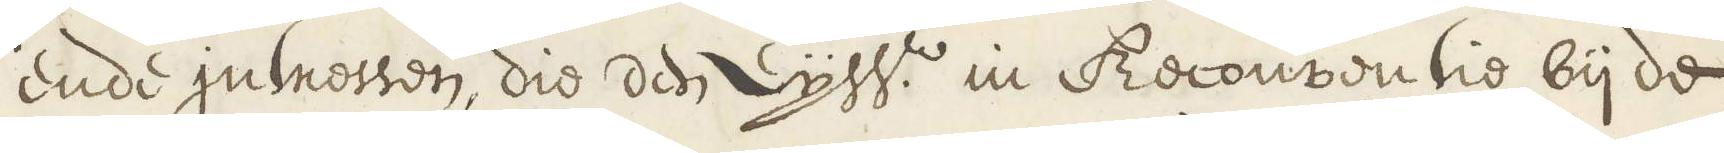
ende jntressen, die den Eijss.r in Reconventie bij de
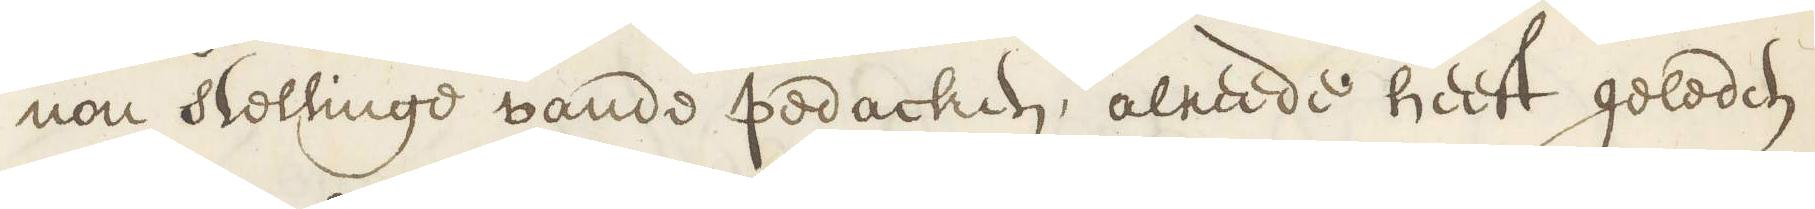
non stellinge vande pedacken, alrede heeft geleden
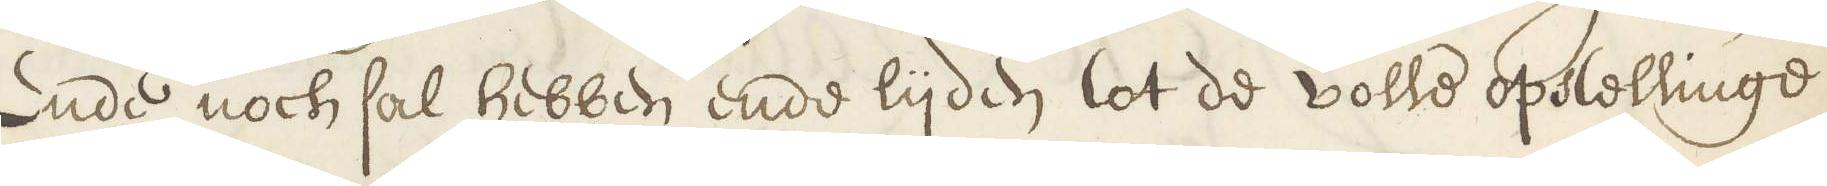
Ende noch sal hebben ende lijden tot de volle opstellinge
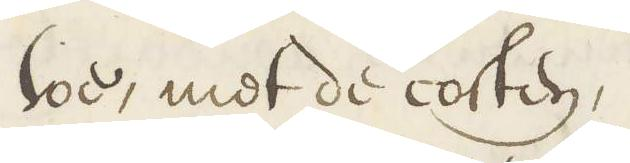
toe, met de costen,
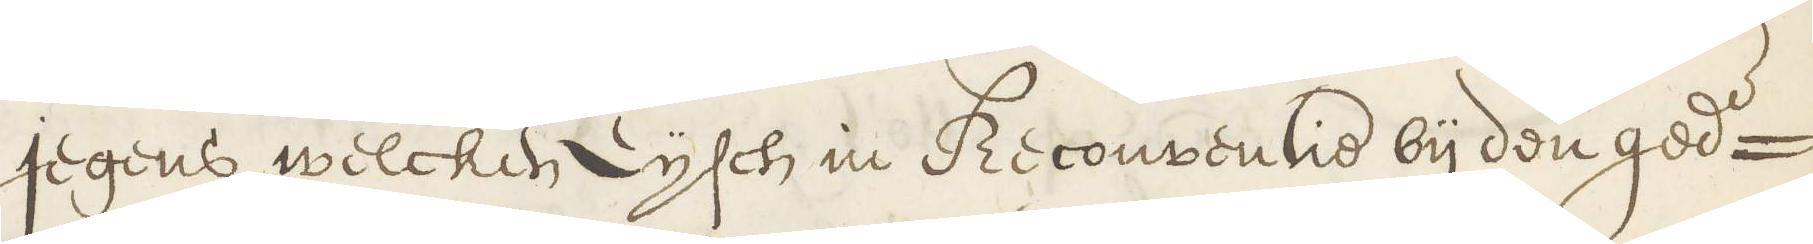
jegens welcken Eijsch in Reconventie bij den ged=e
